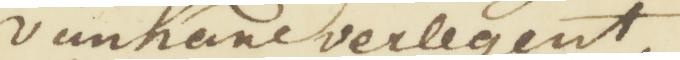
van hare verlegent
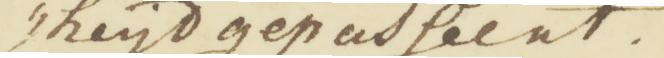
„heijd gepasseert.
